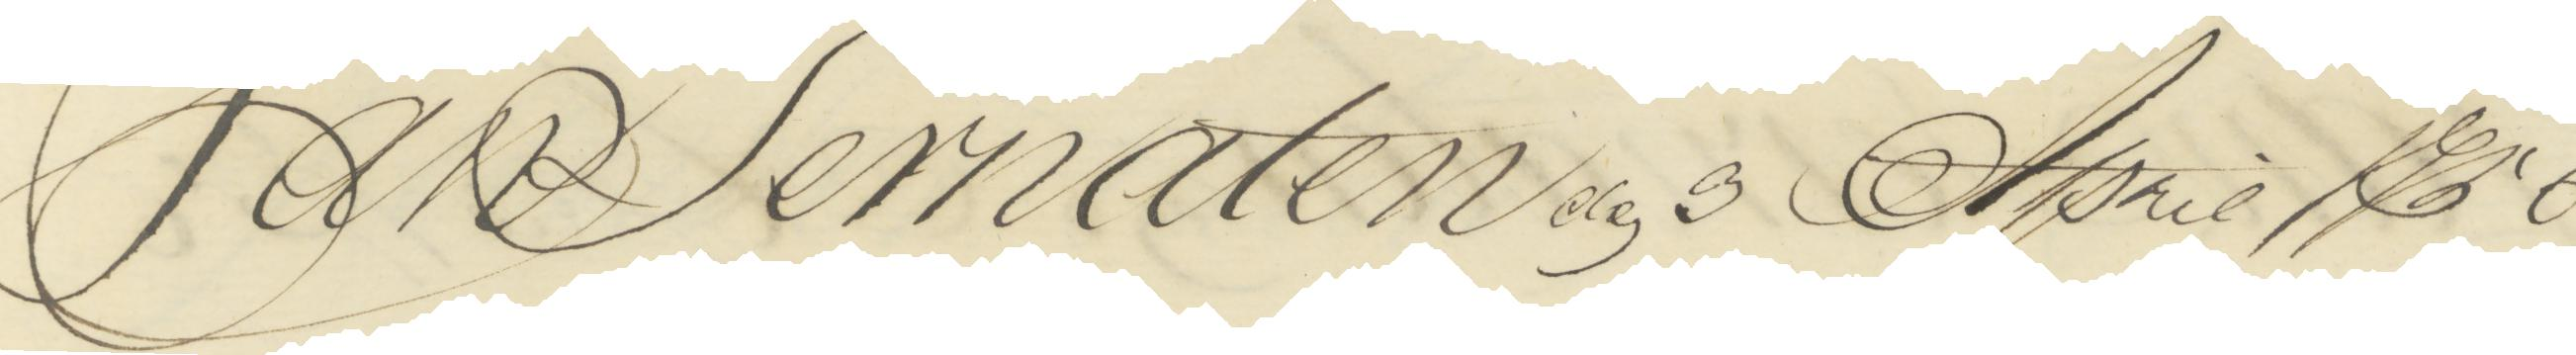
Van Ternaten den 3 April 1756
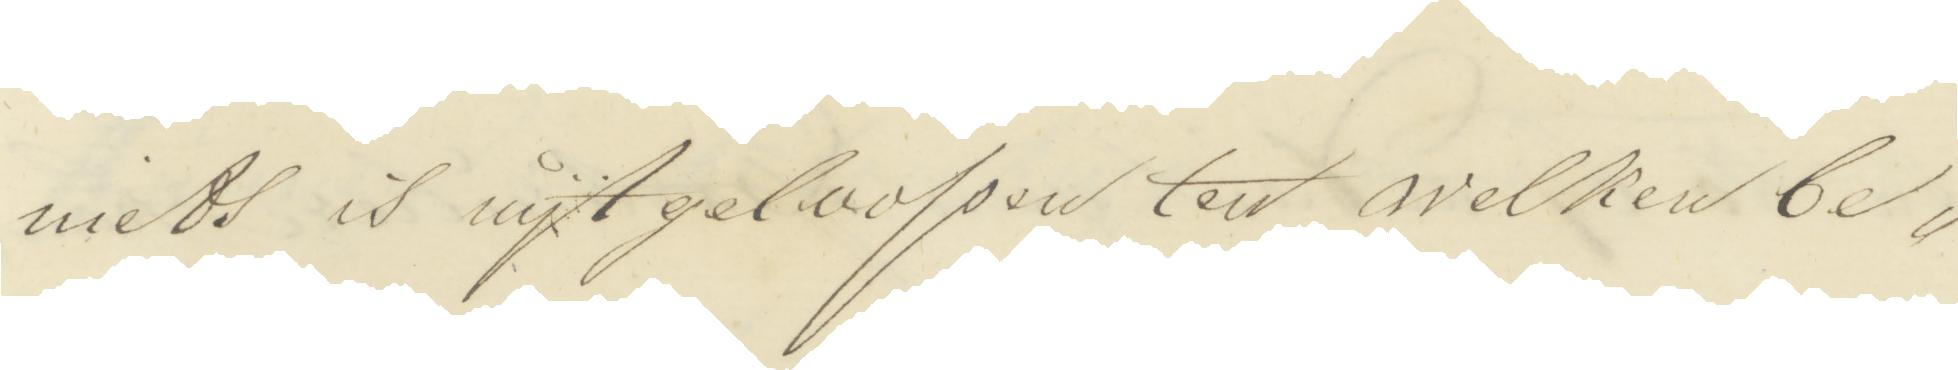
niets is uijtgeloopen ten welken be„
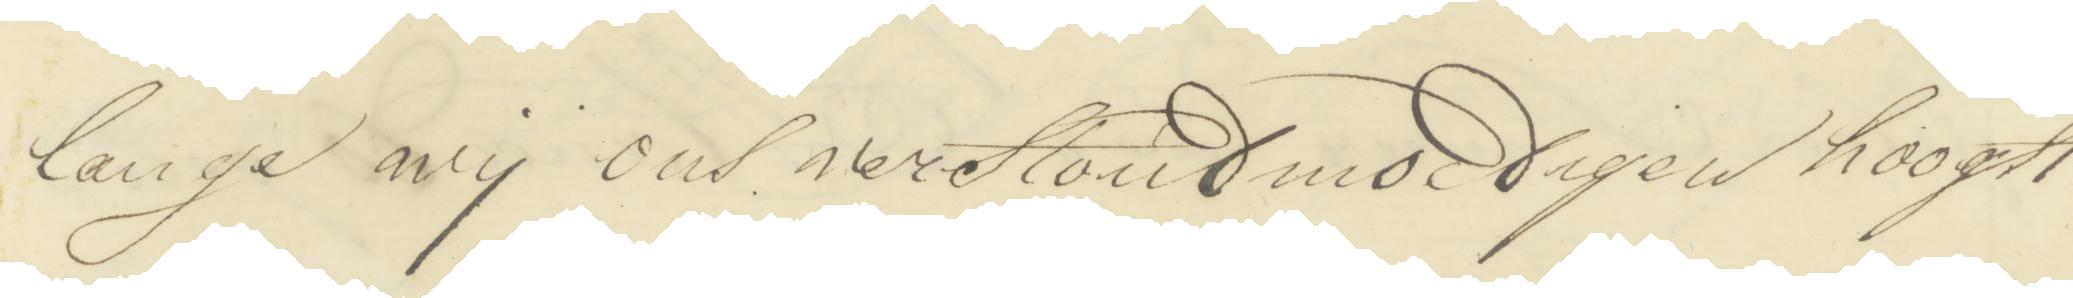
lange wij ons verstoudmoedigen hoogst
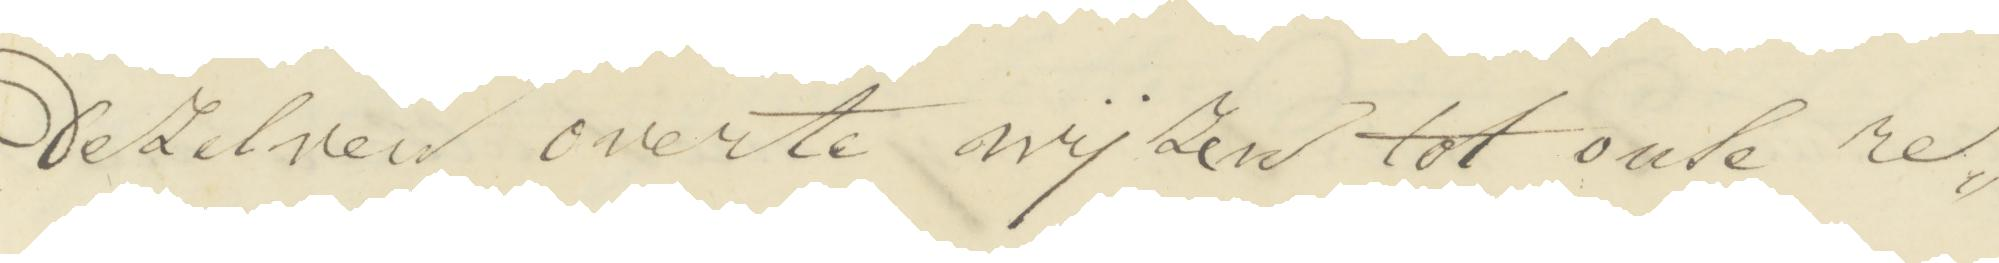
dezelven overte wijzen tot onse re„
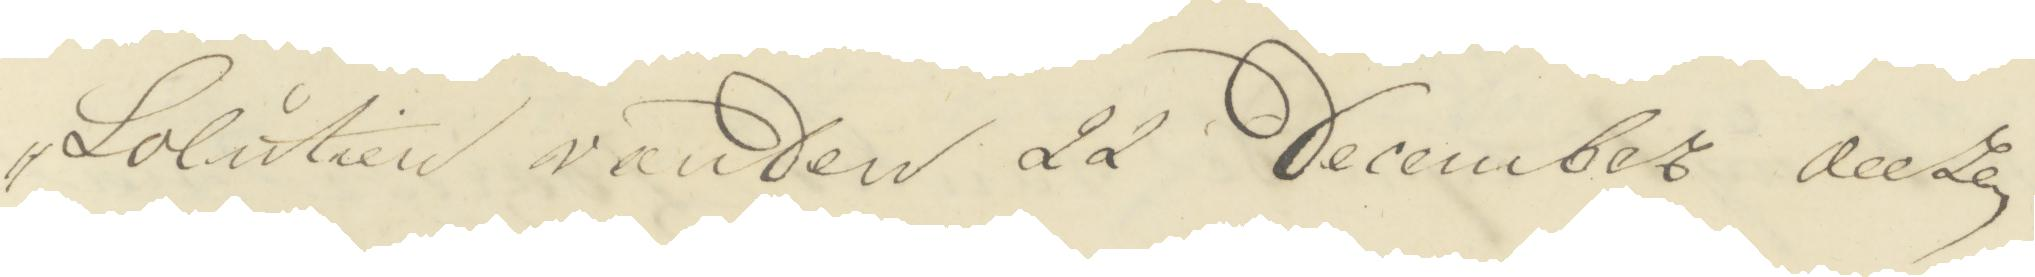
„solutien van den 22 december deezen
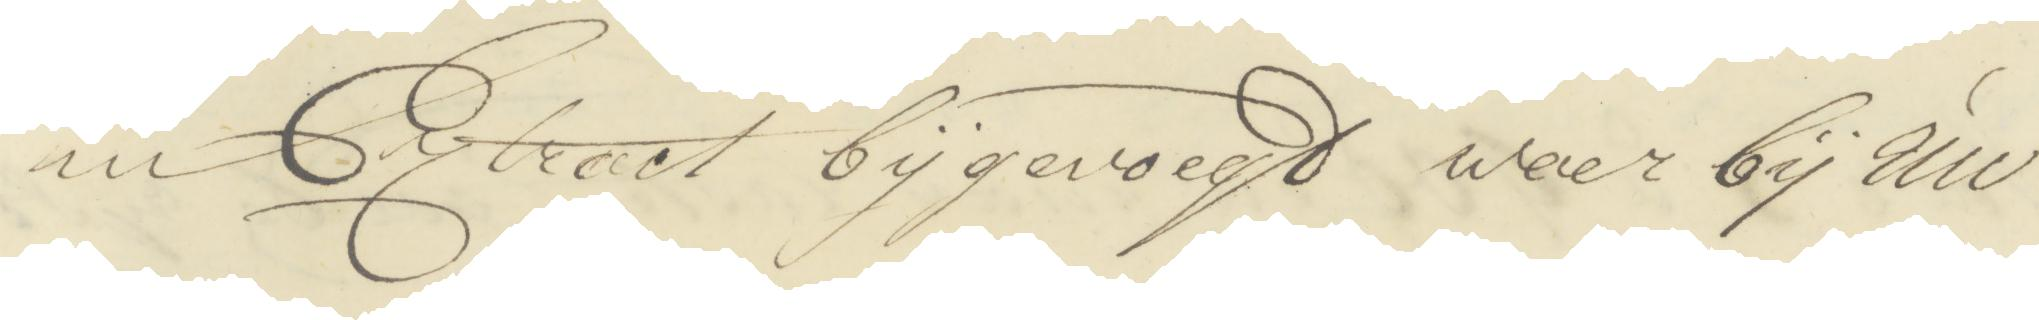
in Extract bijgevoegd waer bij uw
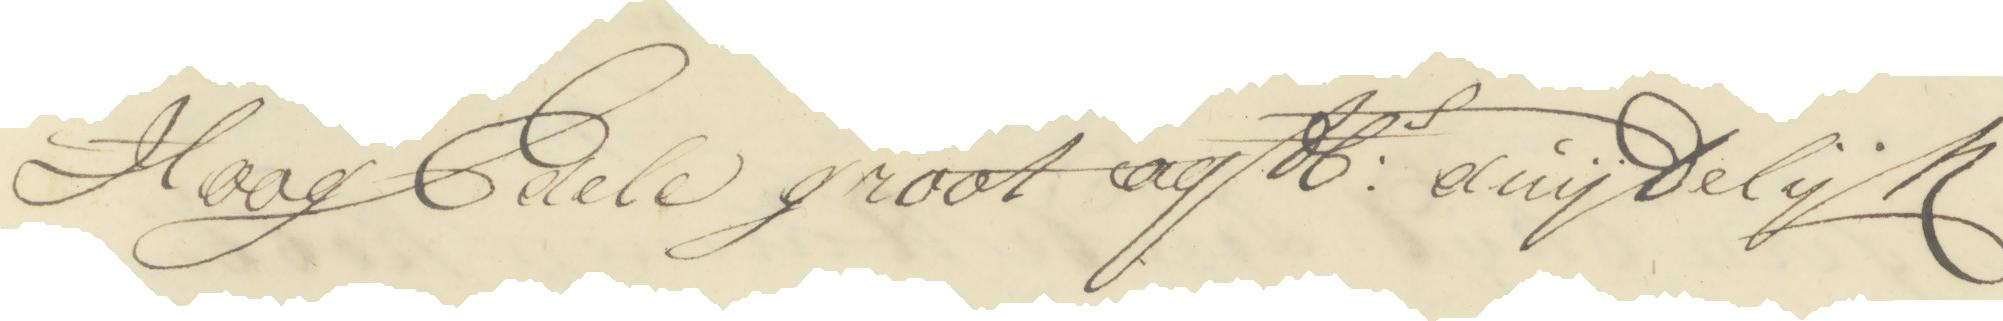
Hoog Edele groot agtb:s duijdelijk
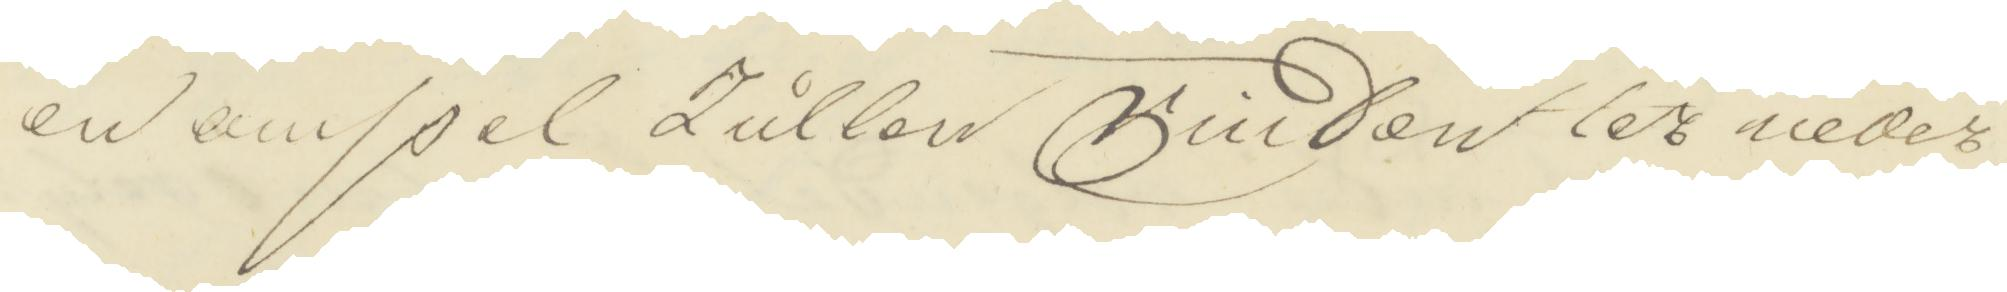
en ampel zullen vinden ter neder
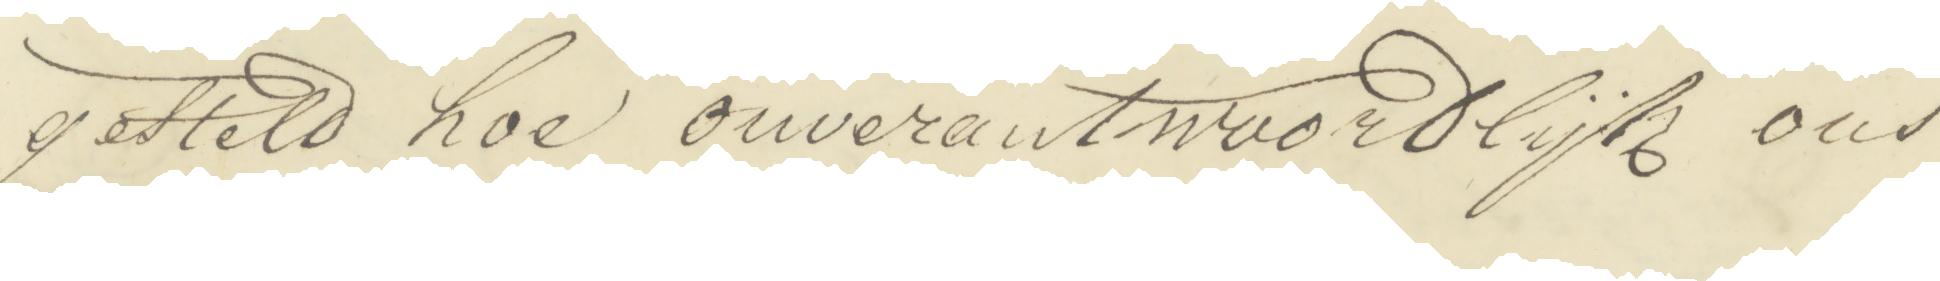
gesteld hoe onverantwoordlijk ons
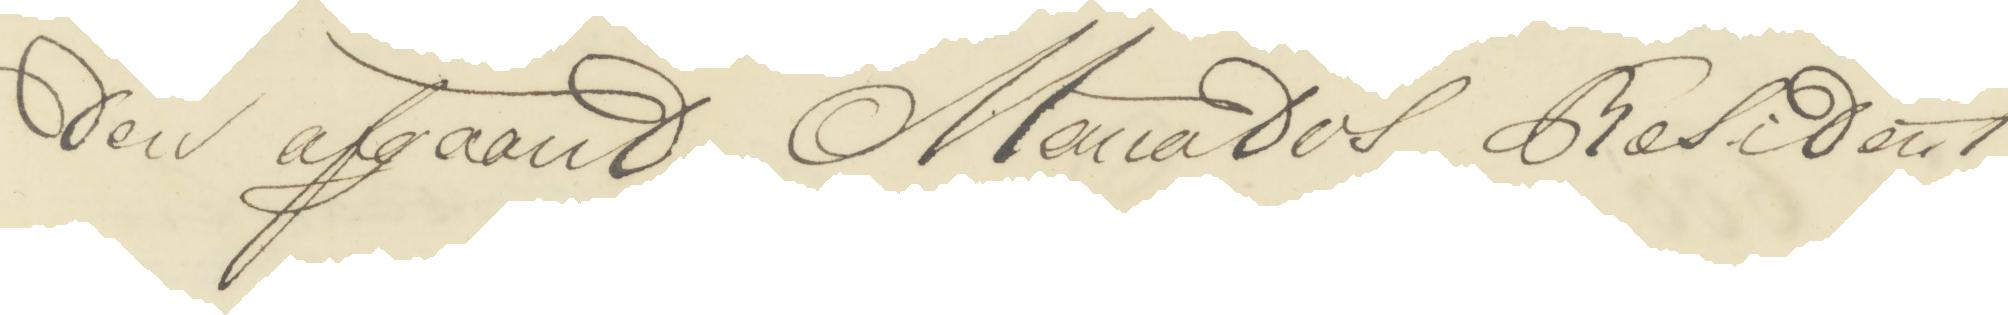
den afgaand Manados Resident
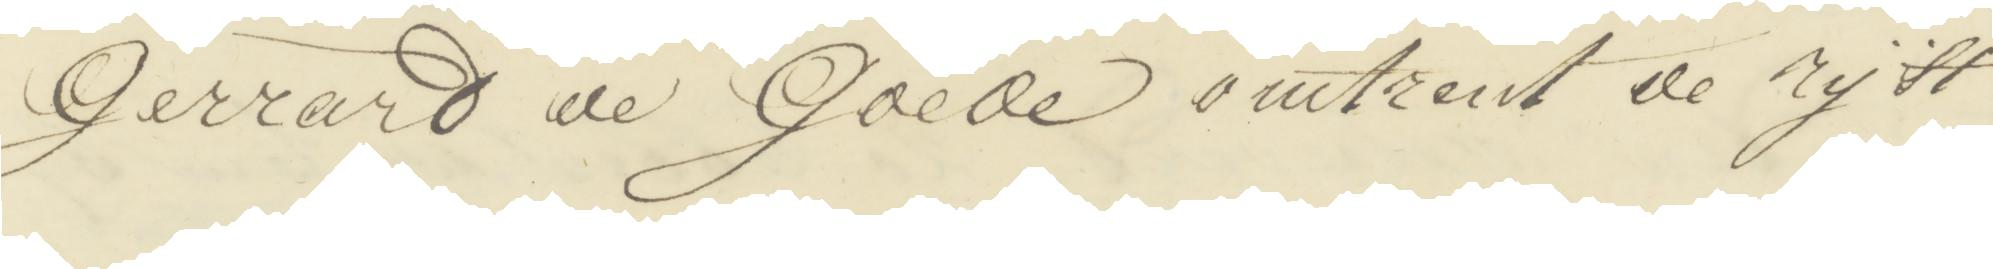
Gerrard de Goede omtrent de rijst
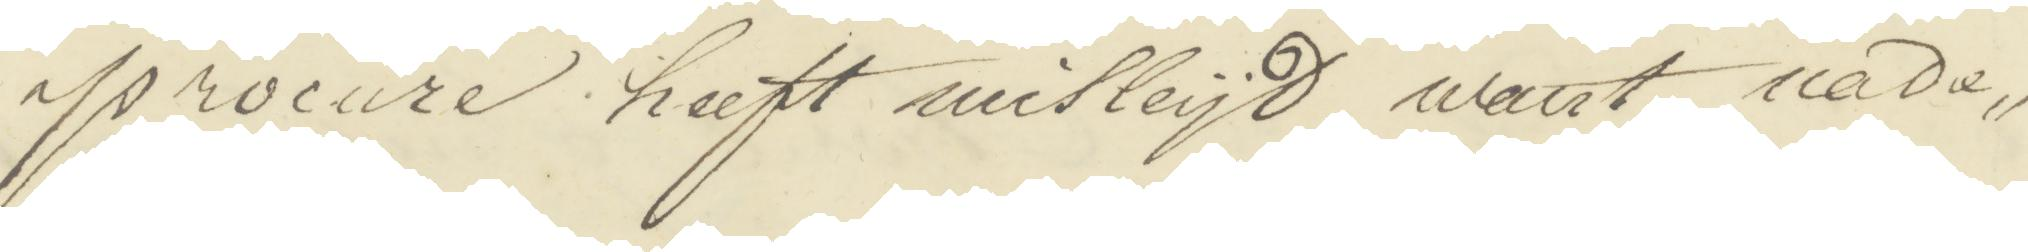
procure heeft misleijd want nade„
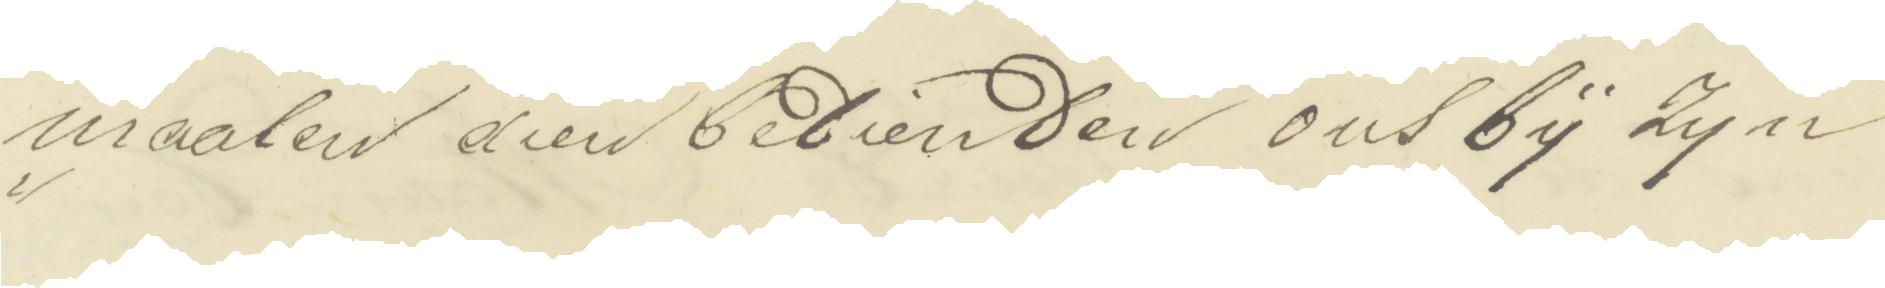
„maalen dien bedienden ons bij zijn
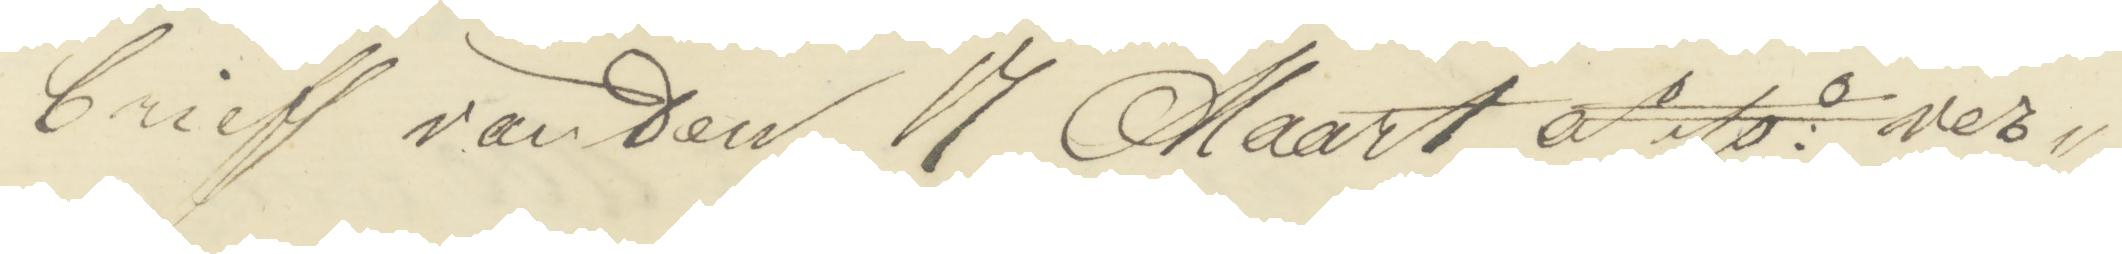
brieff van den 17 Maart ao p:o ver„
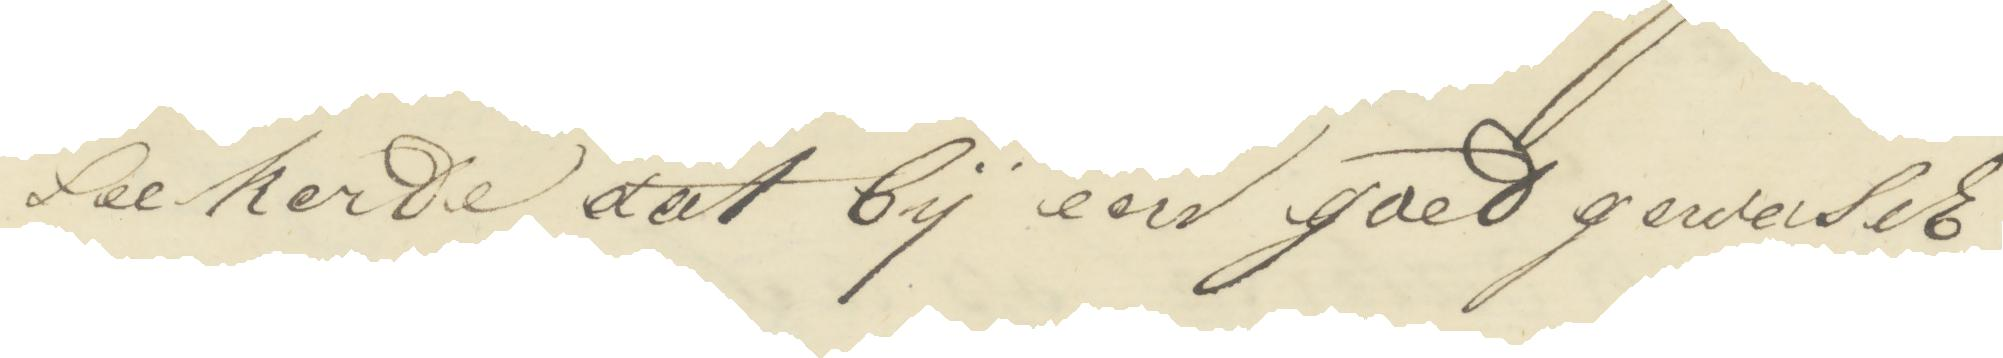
seekerde dat bij een goed gewasch
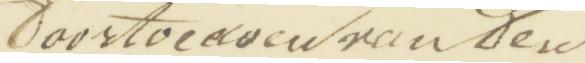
door toedoen van den
